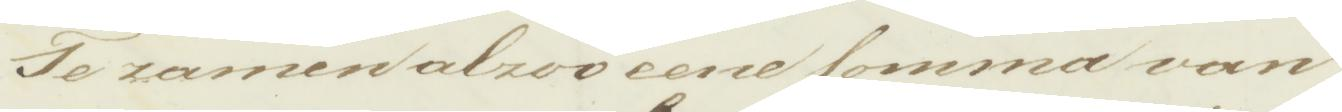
Te zamen alzoo eene somma van
